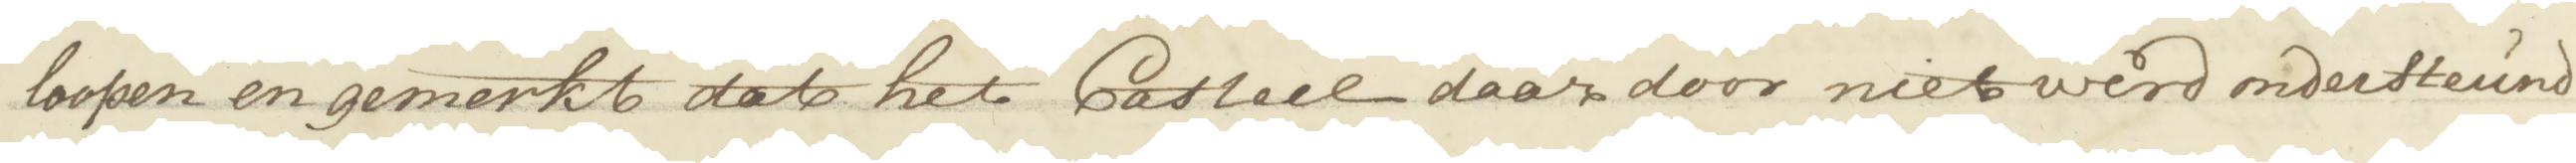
loopen en gemerkt dat het Casteel daar door niet werd ondersteund
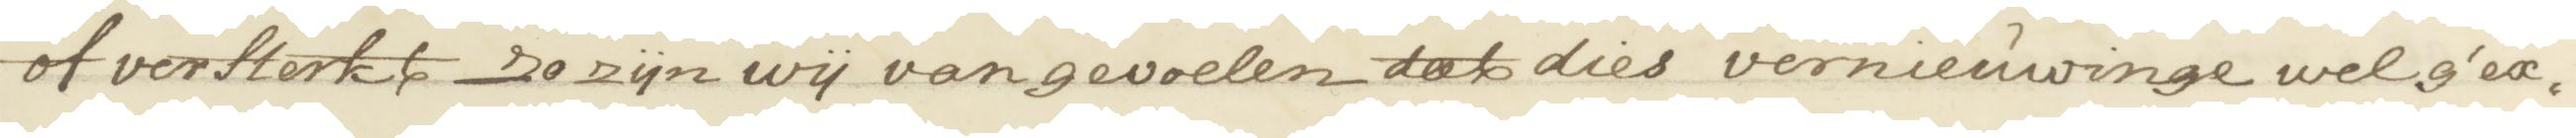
of versterkt zo zijn wij van gevoelen dat dies vernieuwinge wel g’ex„
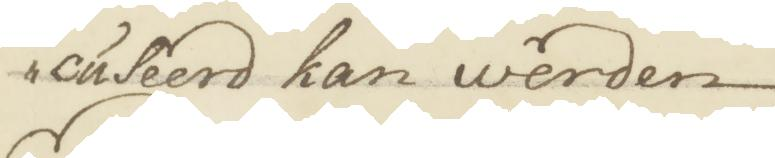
„cuseerd kan werden
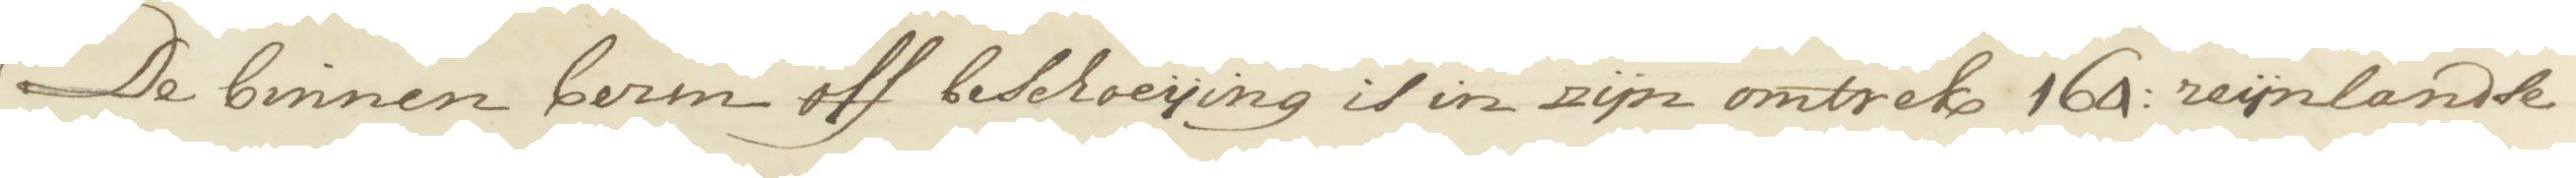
De binnen berm off beschoeijing is in zijn omtrek 164: reijnlandse
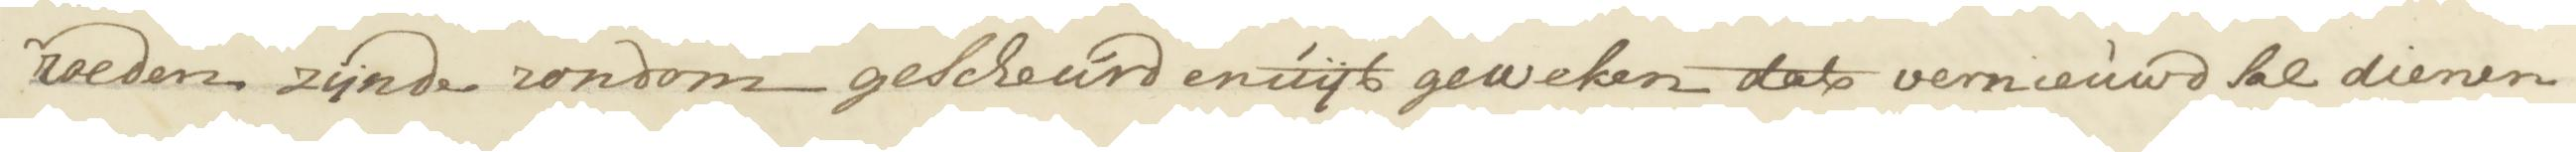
roeden zijnde rondom gescheurd enuijt geweken dat vernieuwd sal dienen
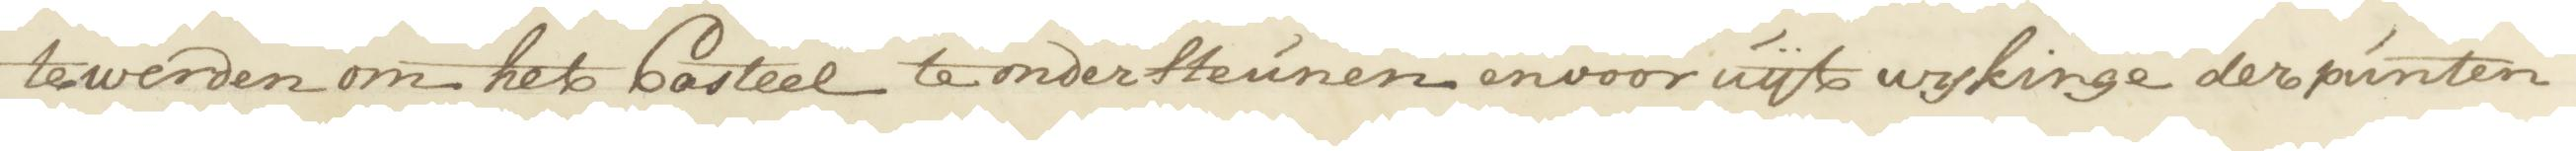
te werden om het Casteel te ondersteunen envoor uijt wykinge der punten
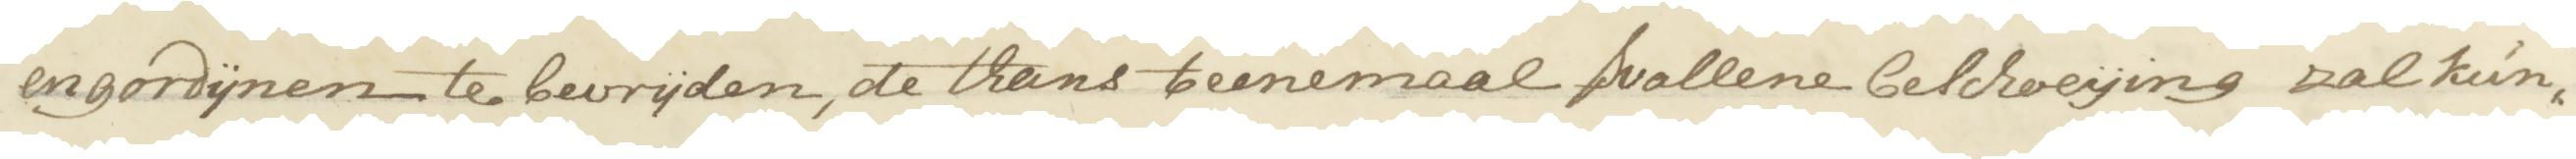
en gordijnen te bevrijden, de thans 't eenemaal vervallene beschoeijing zal kun„
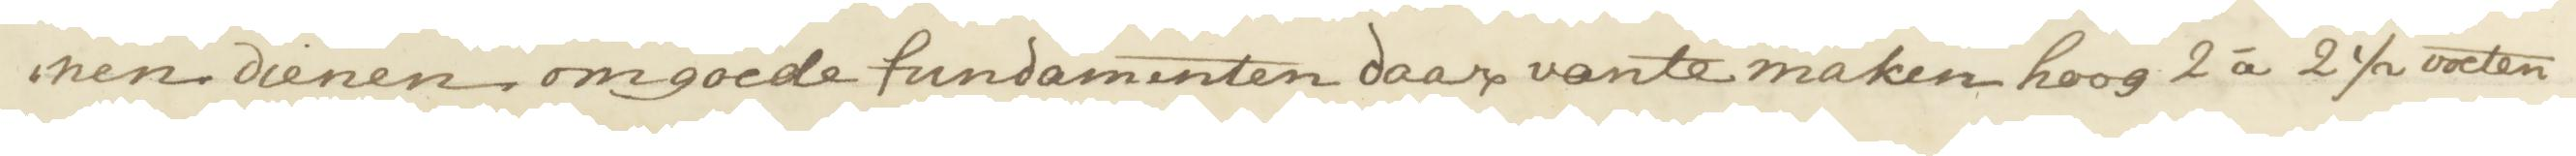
„nen dienen om goede fundamenten daar vante maken hoog 2 à 2½ voeten
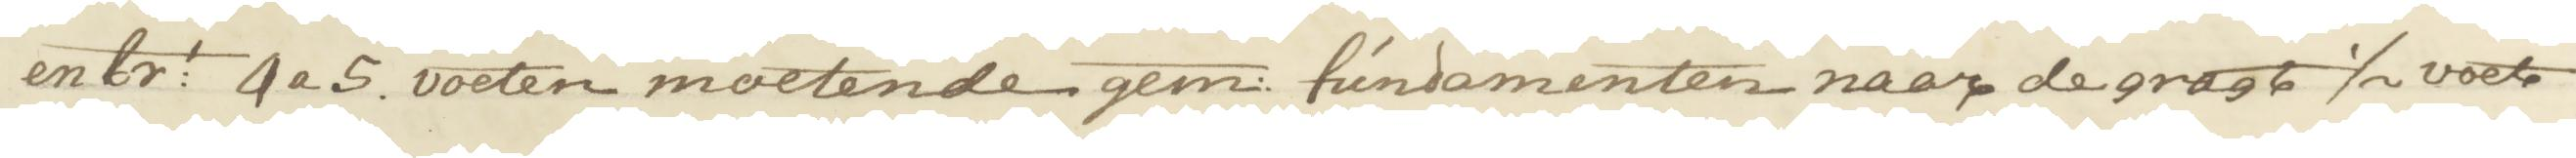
en br:t 4 a 5. voeten moetende gem: fundamenten naar de gragt ½ voet
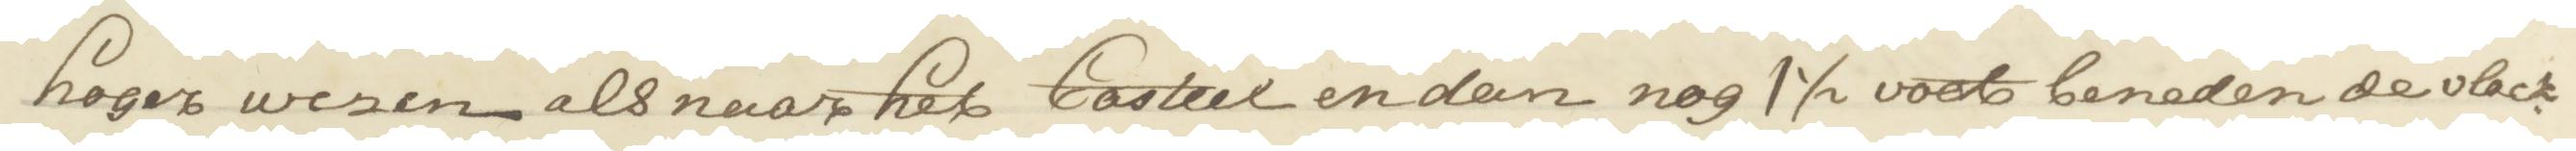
hoger wezen als naar het Casteel en dan nog 1½ voet beneden de vlack
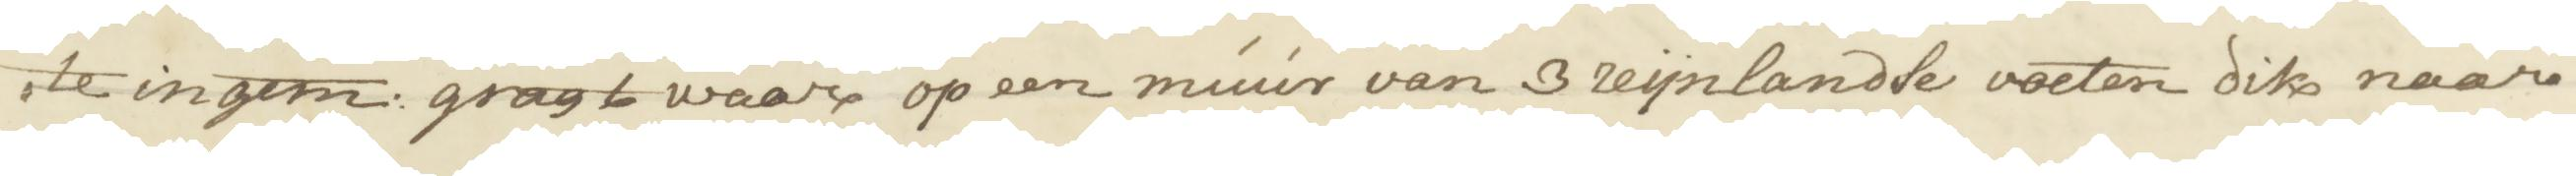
„te in gem: gragt waar op een muur van 3 reijnlandse voeten dik naar
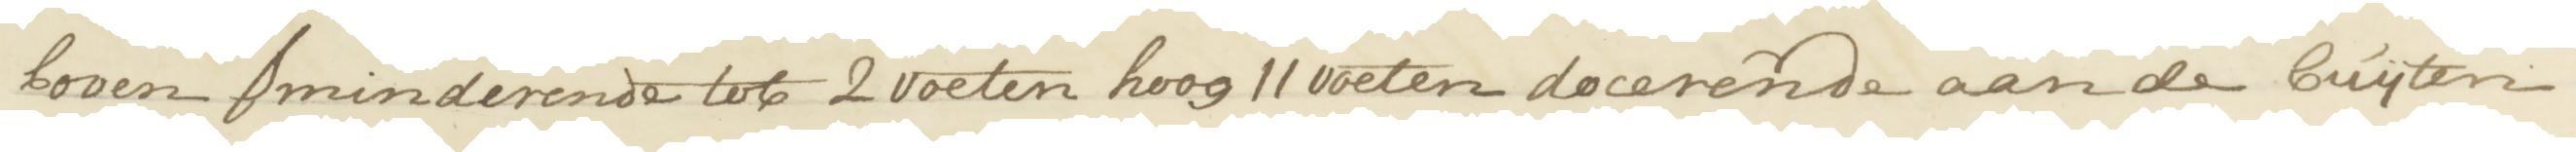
boven verminderende tot 2 voeten hoog 11 voeten docerende aan de buijten
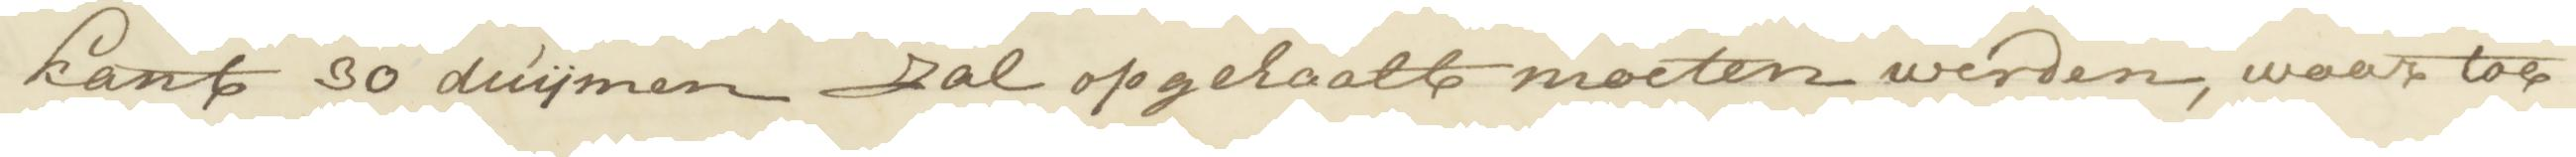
kant 30 duijmen zal op gehaalt moeten werden, waar toe
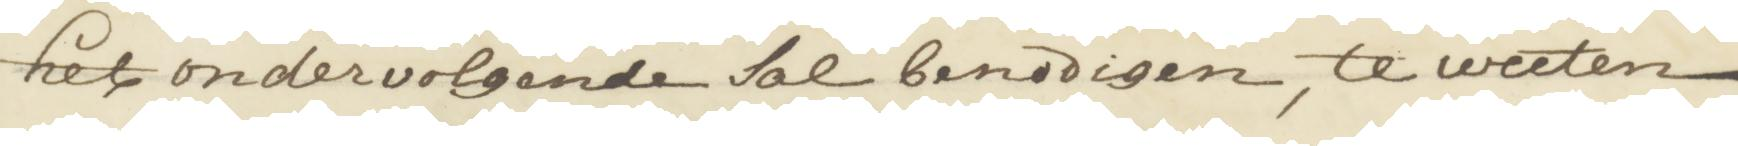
het ondervolgende sal benodigen, te weeten
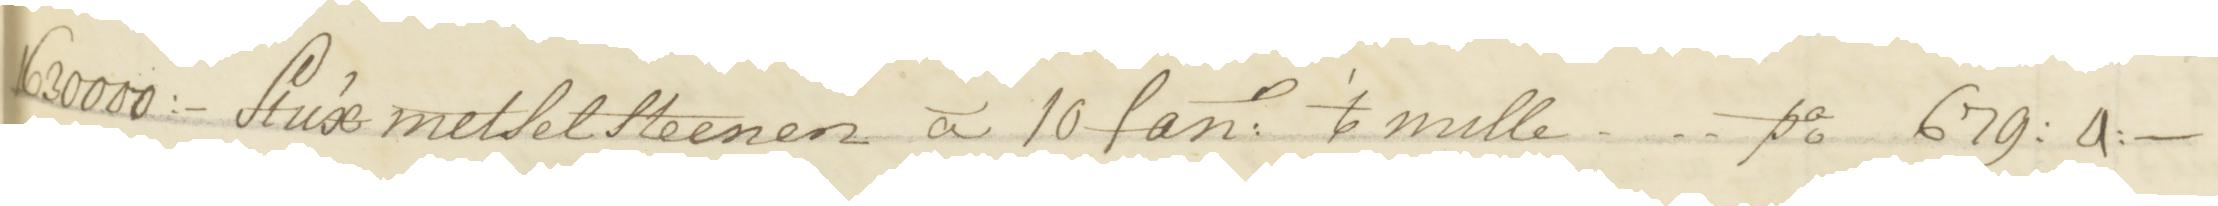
1630000 :- stux metselsteenen â 10 fan:s 't mille - - - p a/o 679: 4:—
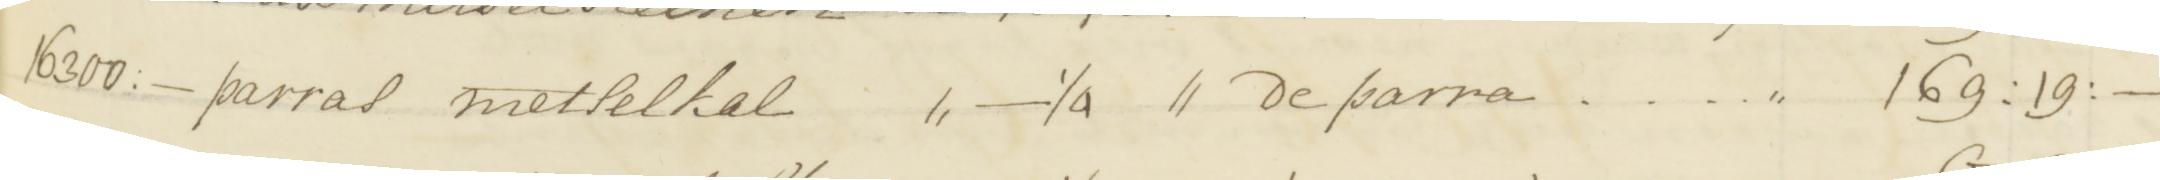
16300:— parras metselkal - „ —¼ „ de parra - - - „ 169: 19: —
